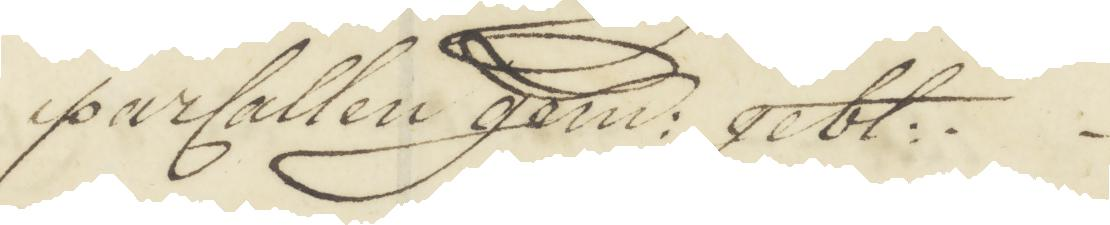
10. „ parcallen gem: gebl: . . . . „ 22: 14:8 „ 91: — 8
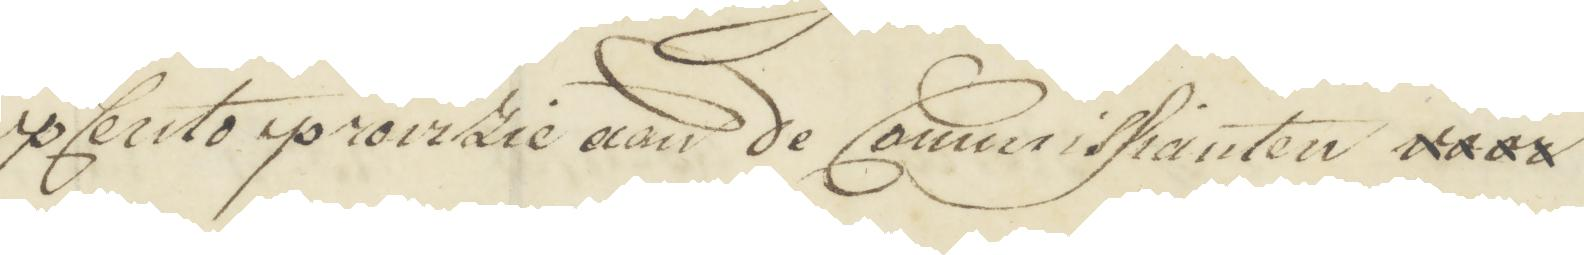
5 prCento proirzie aan de Commissianten voor
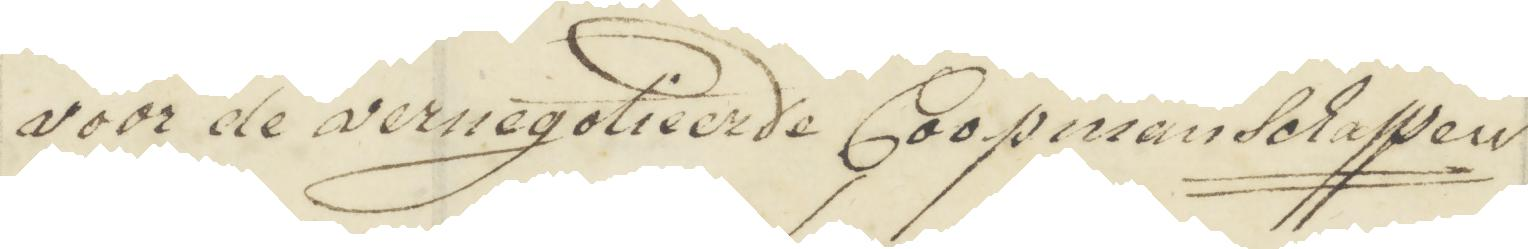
voor de vernegotieerde Coopmanschappen
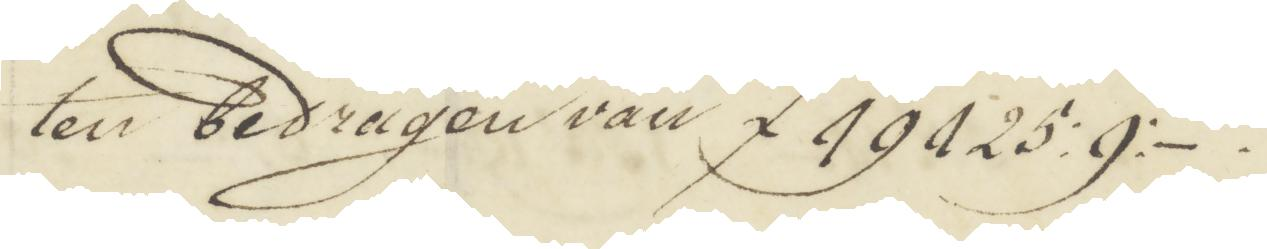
ten bedragen van ƒ49425:9:— . . . ƒ2471: 5:—
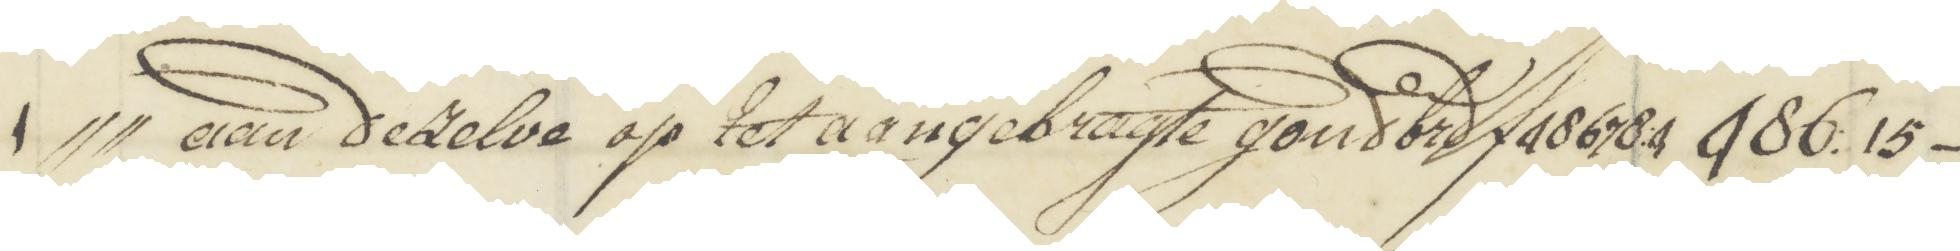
1„„ aan dezelve op het aangebragte goud brd ƒ48678:4 486: 15—
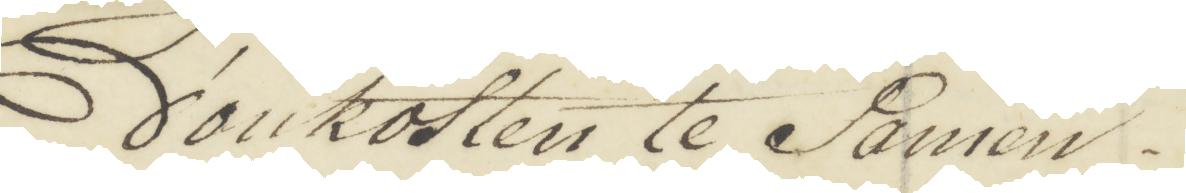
d'onkosten te samen - - - - - - - ƒ4000. 5:
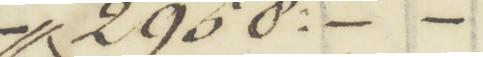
„2958: — —
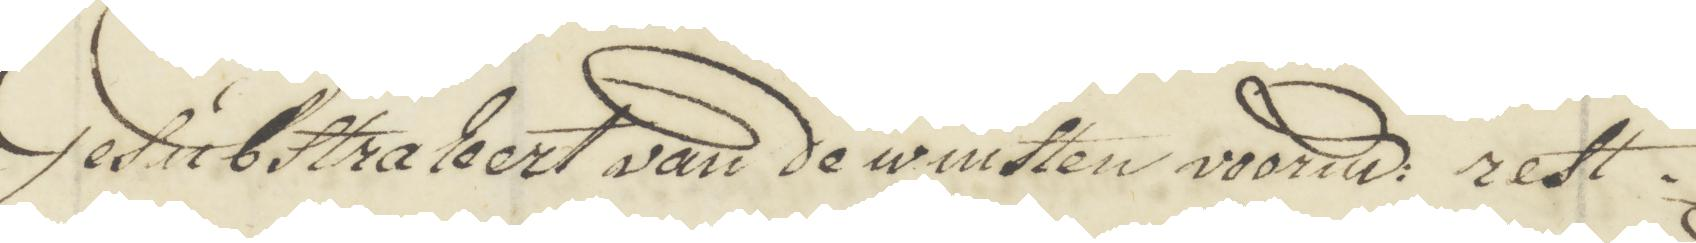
Gesubstraheert van de winsten voorm: rest . . . . . . „ 7022: 11:
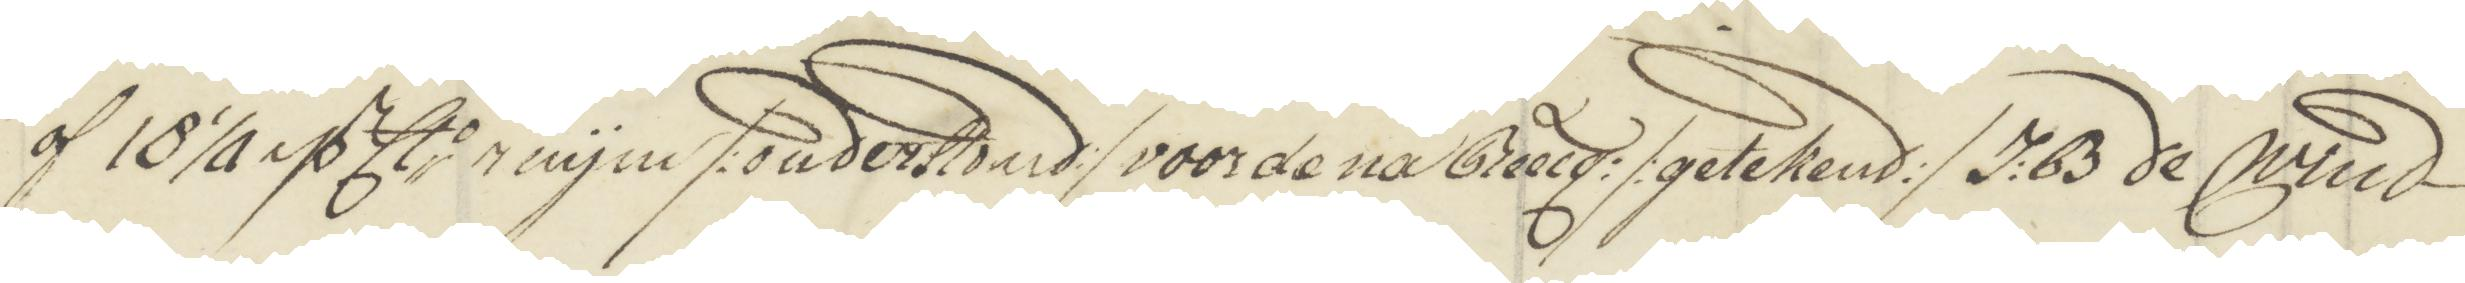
of 18¼. prCt:o ruijm /:onderstond:/ voor de na Reecq :/: getekend :/ J:B de Wind
